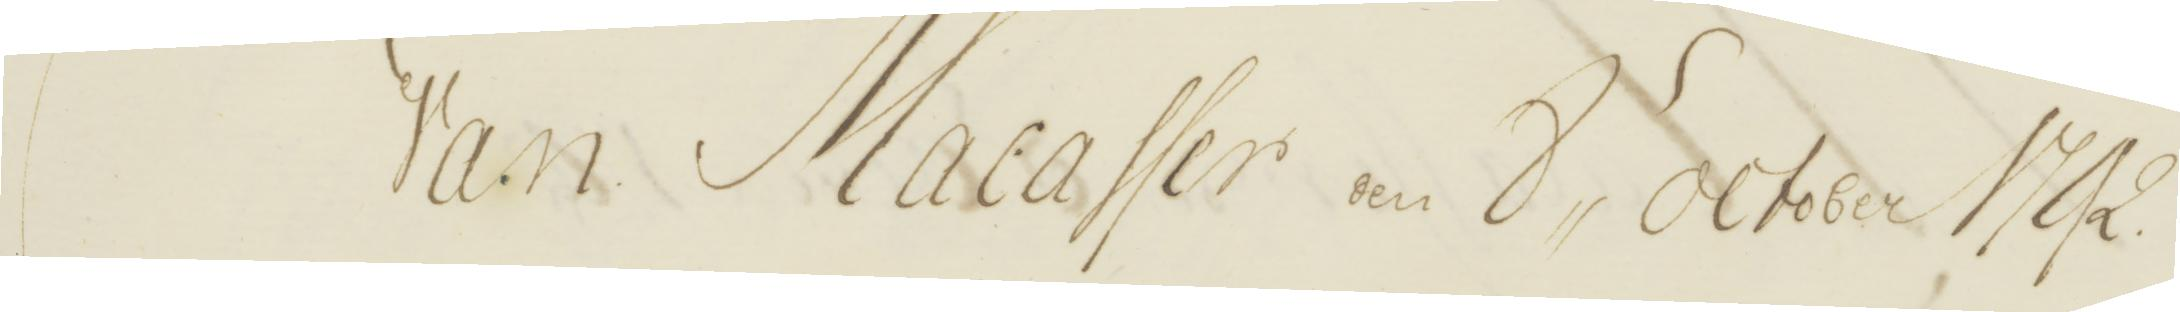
Van Macasser den 8„' October 1742.
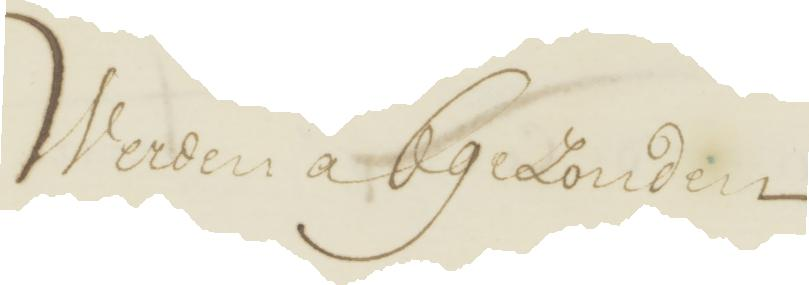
Werden afgezonden
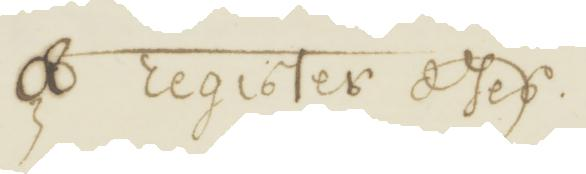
de register deses.
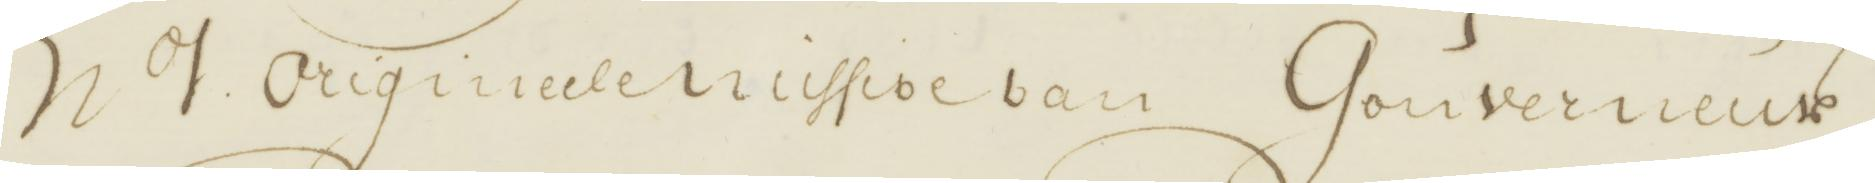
No 1. Origineele missive van Gouverneur
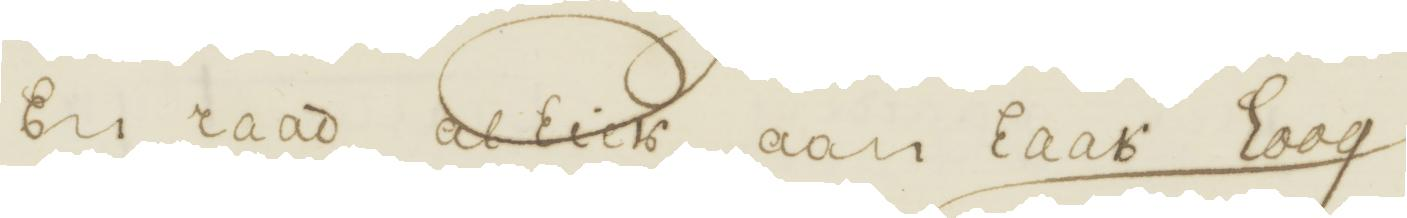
En raad alhier aan haar hoog
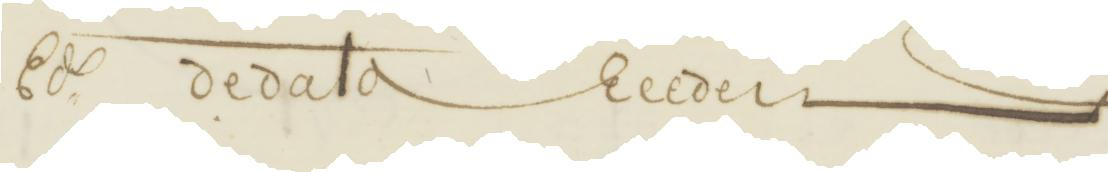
Ed: dedato heeden
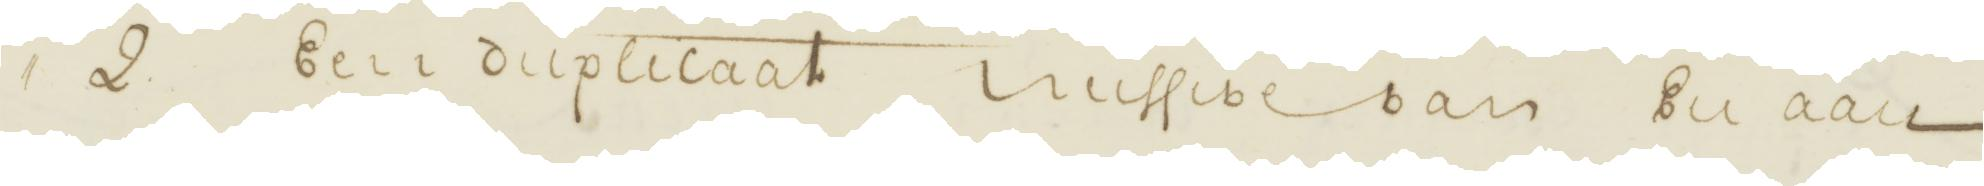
„ 2 Een duplicaat missive van En aan
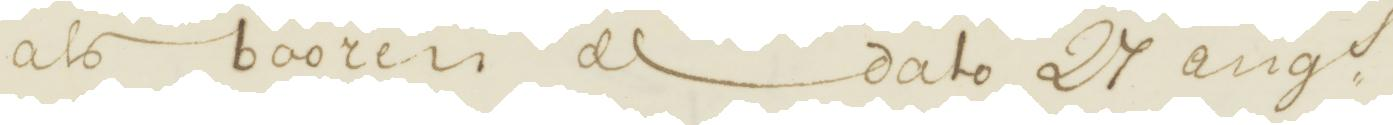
als vooren de dato 27 aug„s
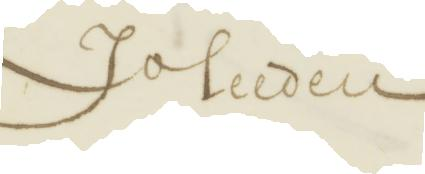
Joleeden
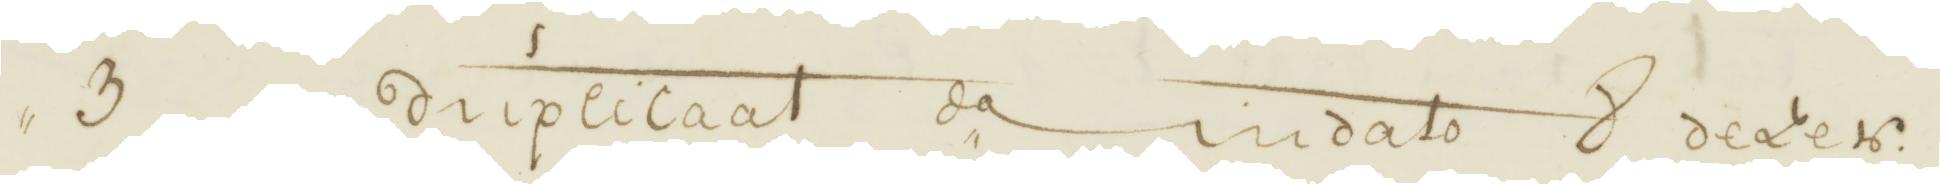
„ 3 „ duplicaat d„o indato 8 dezer.
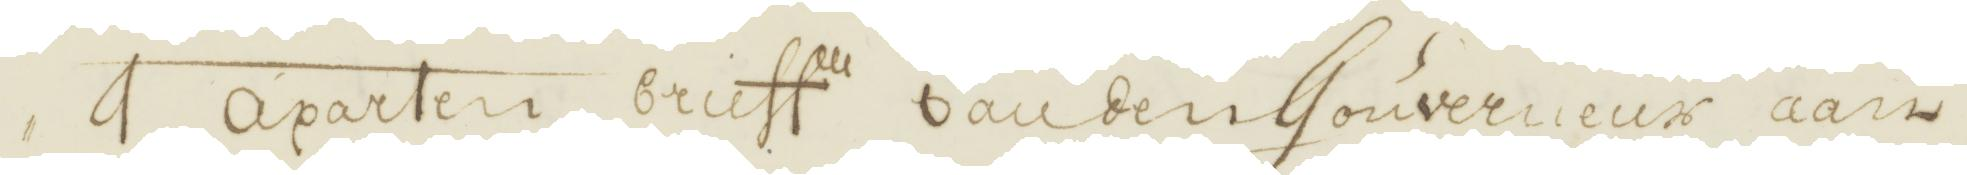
„ 4 aparten brieff van den Gouverneur aan
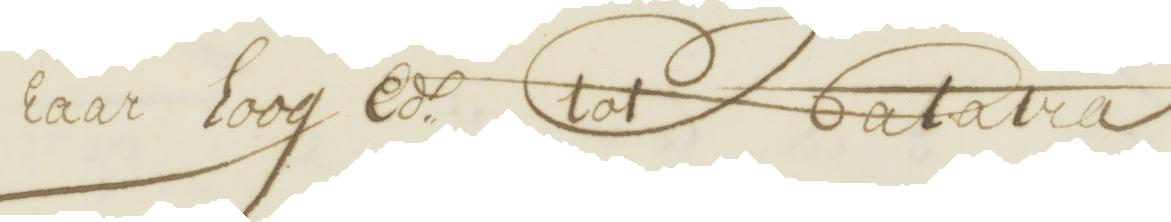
haar hoog Ed„s tot batavia
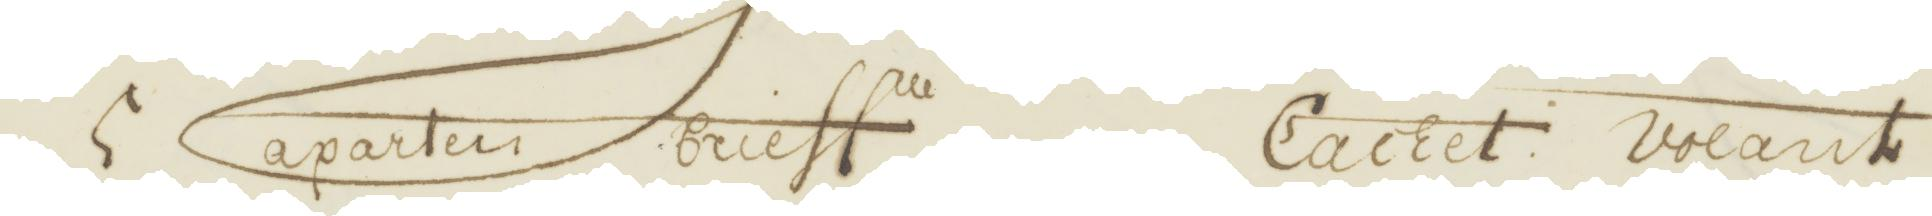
„ 5 aparten brieff=m onder Cachet volant
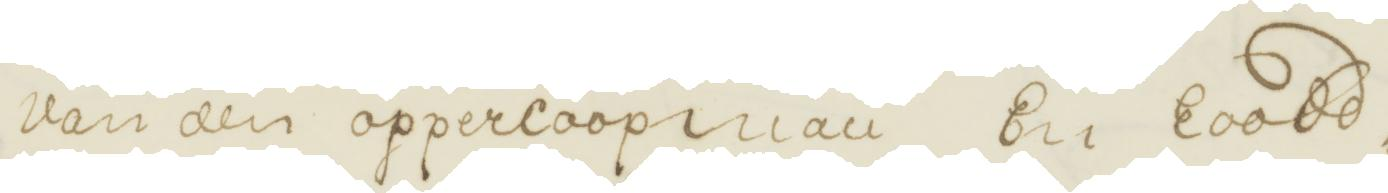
van den oppercoopman En hoofd„
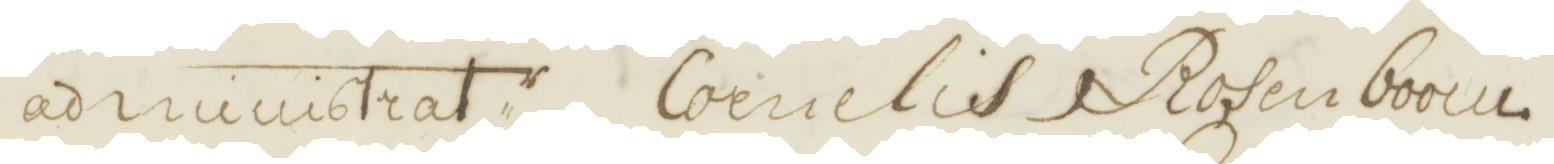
administrat:r Cornelis Rosenboom
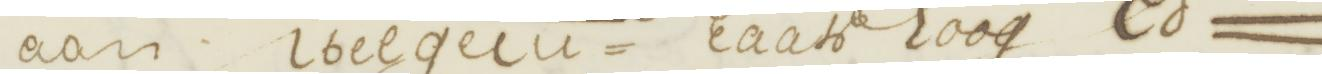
aan welgem=e haar hoog Ed=s
